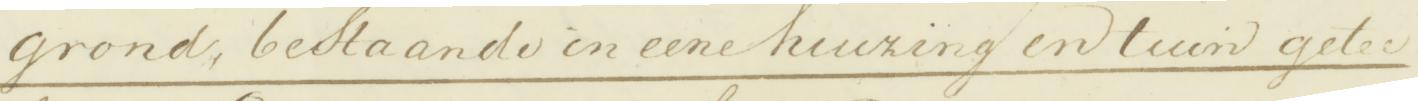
grond, bestaande in eenehuizing en tuin getee
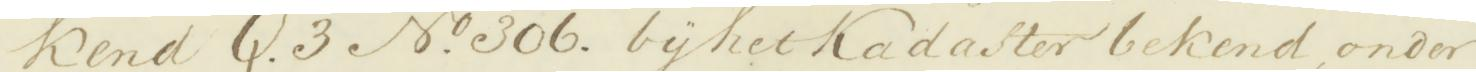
kend Q. 3 N.o 306. bijhet Kadaster bekend, onder
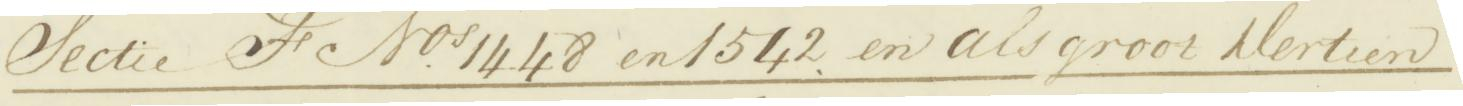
Sectie F N.os 1448 en1542 en als groot Dertien
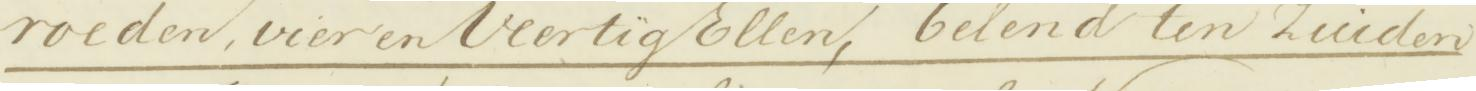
roeden, vier enVeertigEllen, belend ten Zuiden
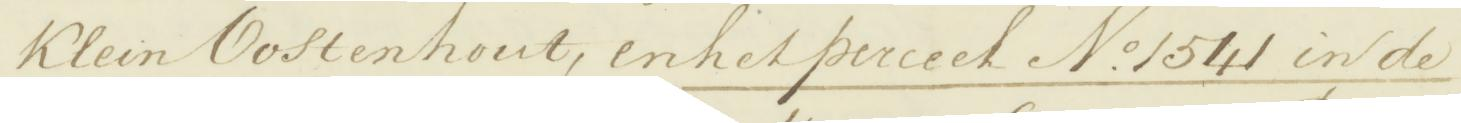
Klein Oostenhout, en het perceel N.o 1541 in de
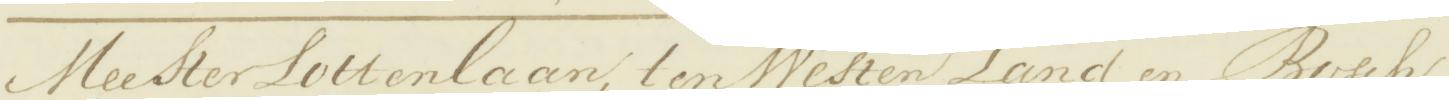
MeesterLottenlaan, ten Westen Land en Bosch,
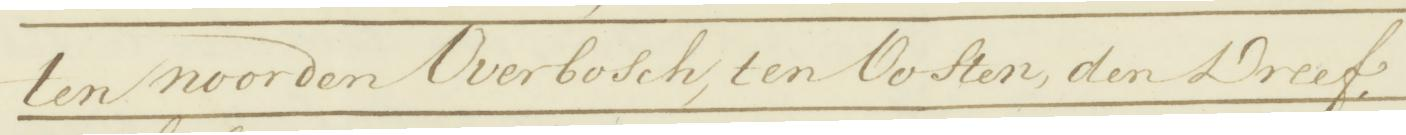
ten noorden Overbosch, ten Oosten den Dreef
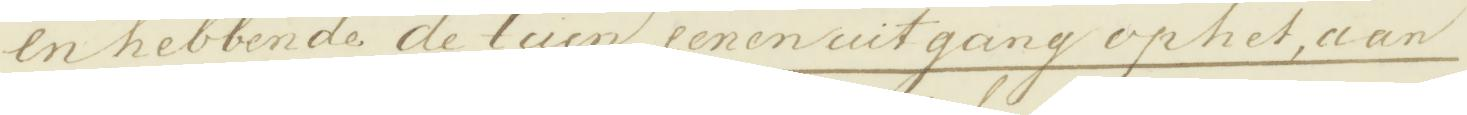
en hebbende de tuin, eenen uitgang op het, aan
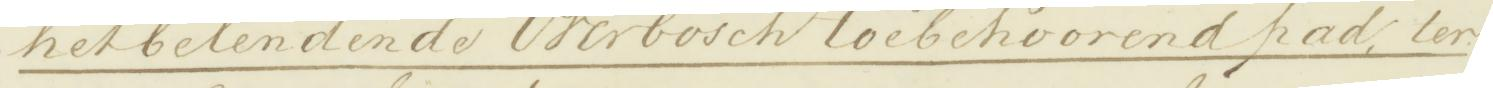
het belendende Overbosch toebehoorend pad, ter
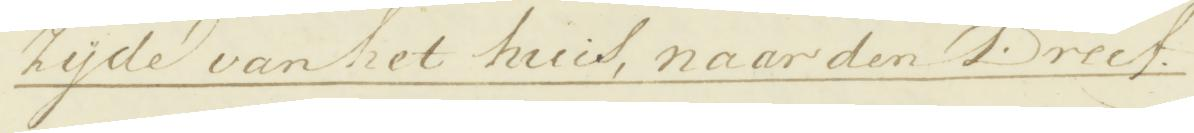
zijde van het huis, naar den Dreef.
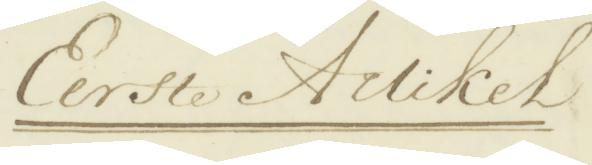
Eerste Artikel
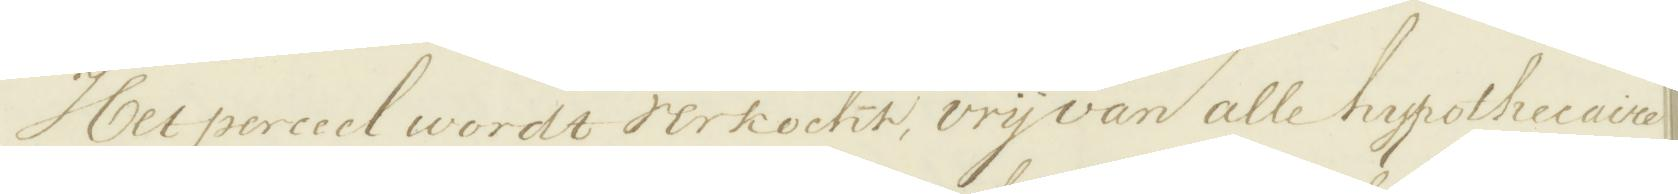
Het perceel wordt verkocht, vrij van alle hypothecaire
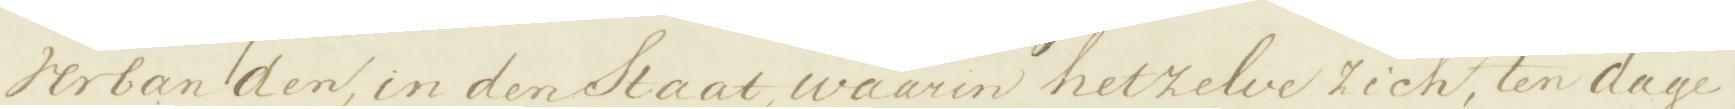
verbanden, in denstaat, waarin hetzelve zich, ten dage
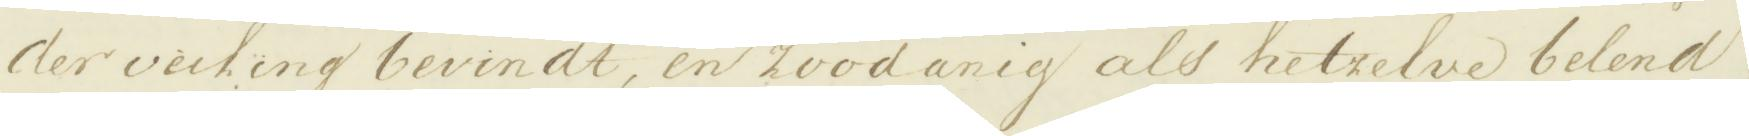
der veiling bevindt, en zoodanig als hetzelve belend
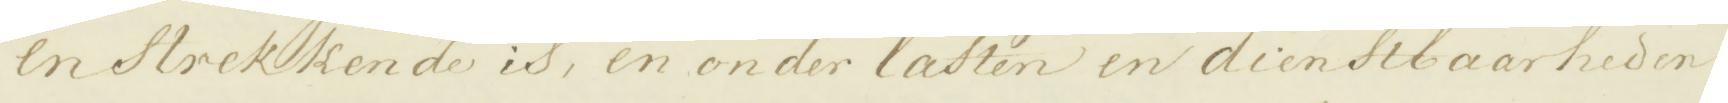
en strekkende is, en onder lasten en dienstbaarheden
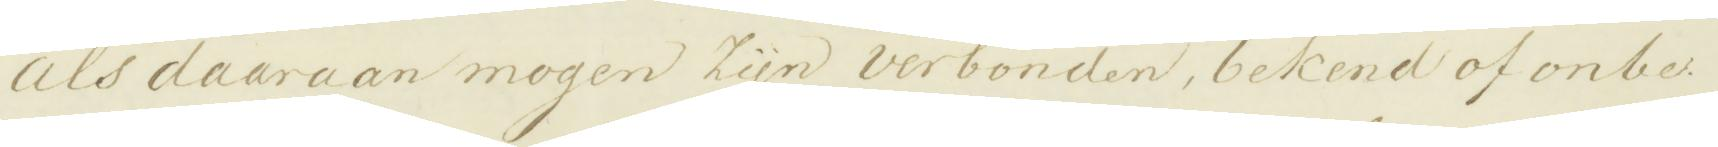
als daaraan mogen zijn verbonden, bekend of onbe„
